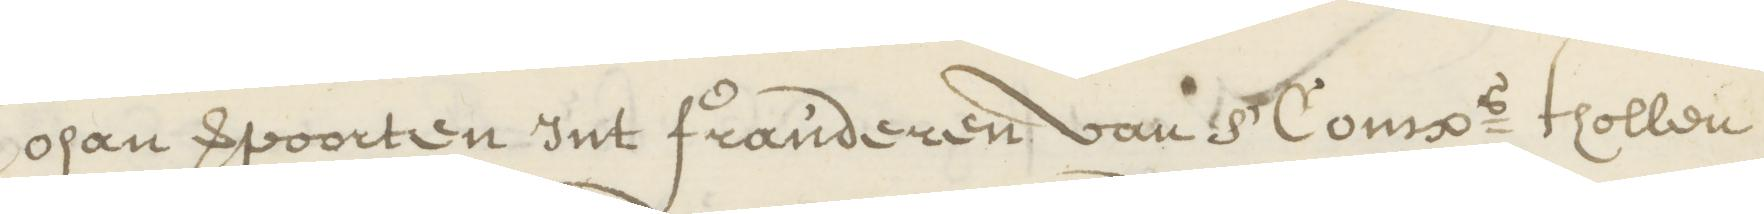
Johan verpoorten Int frauderen van s'Comp=s thollen
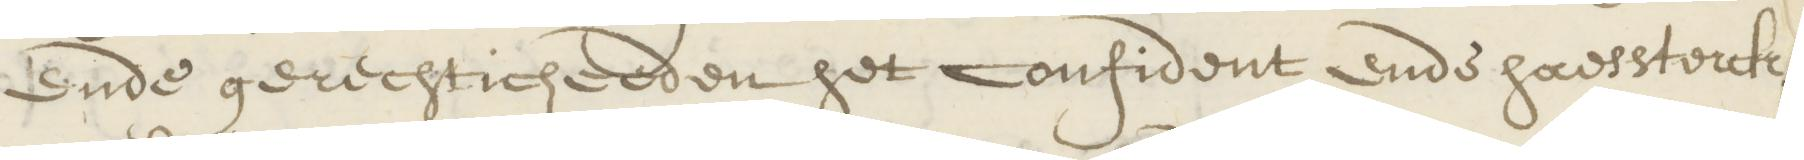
Ende gerechticheeden het confident ende haessterck
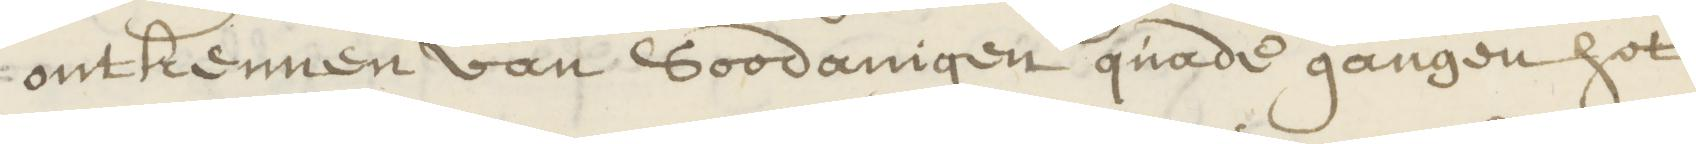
ontkennen van soodanigen quade gangen het
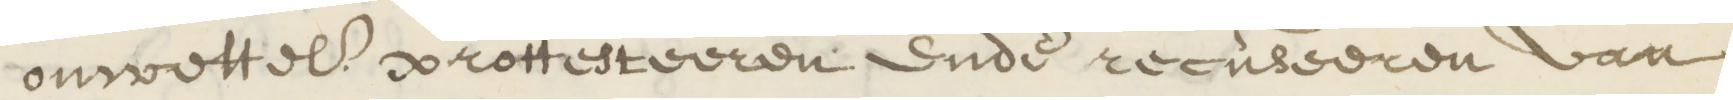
onwettelijk prottesteeren Ende recuseeren van
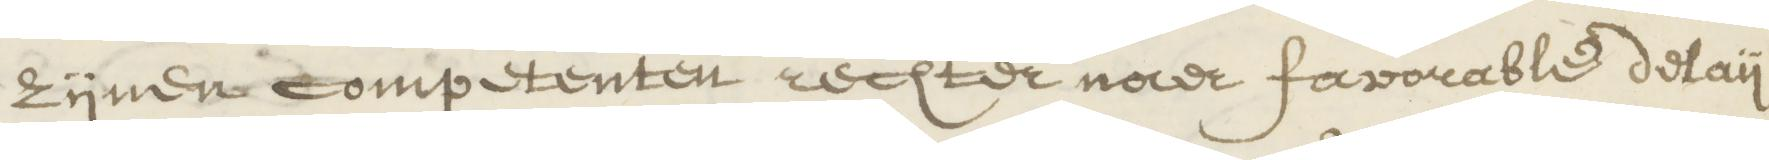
zijnen competenten rechter naer favorable delaij
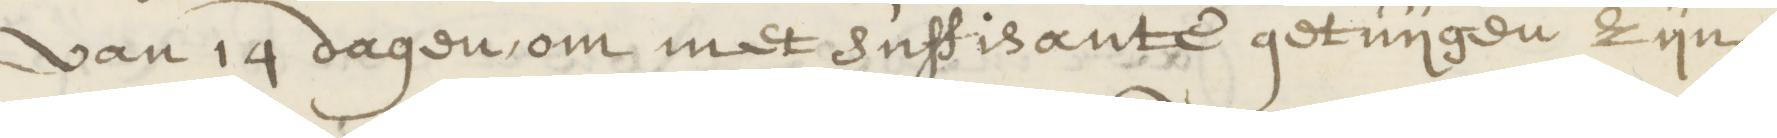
van 14 dagen, om met suffisante getuijgen zijn
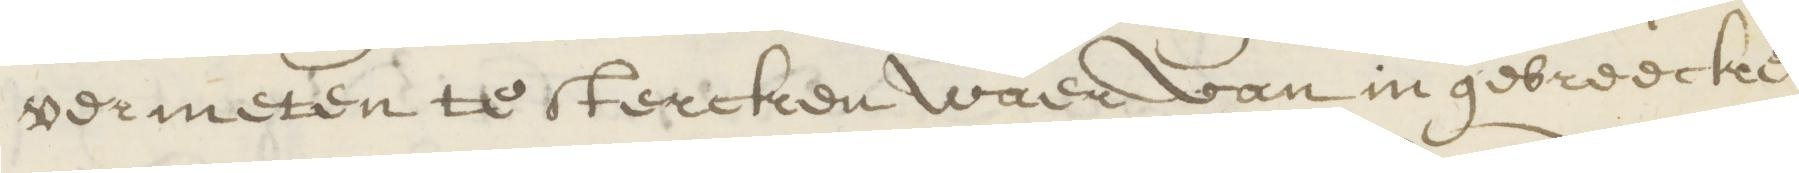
vermeten te stercken waer van in gebreecke
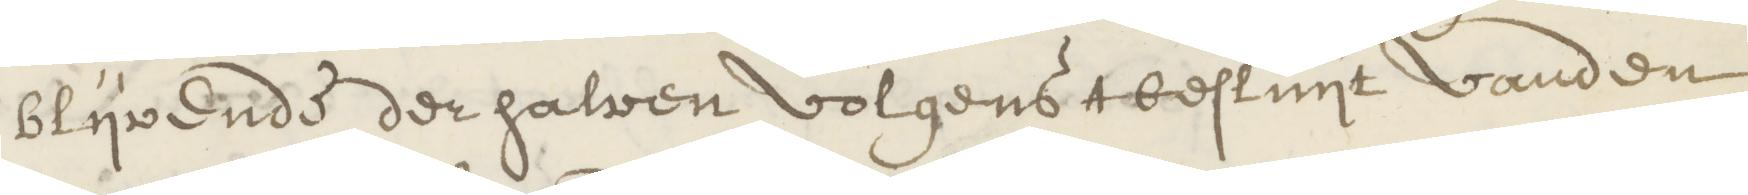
blijvende derhalven volgens 't besluijt vanden
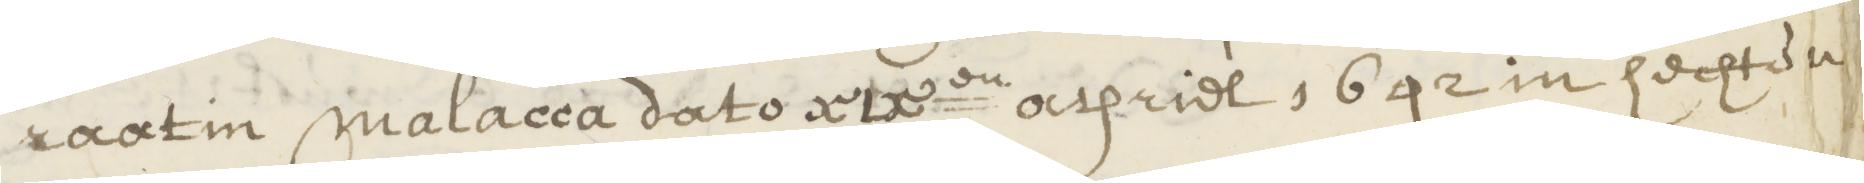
raat in malacca dato xix=en apriel 1642 in hechte
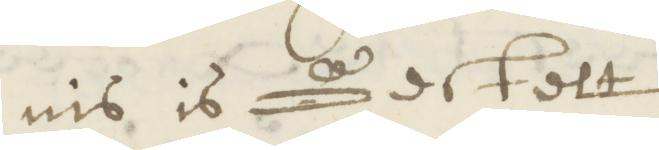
nis is Gestelt
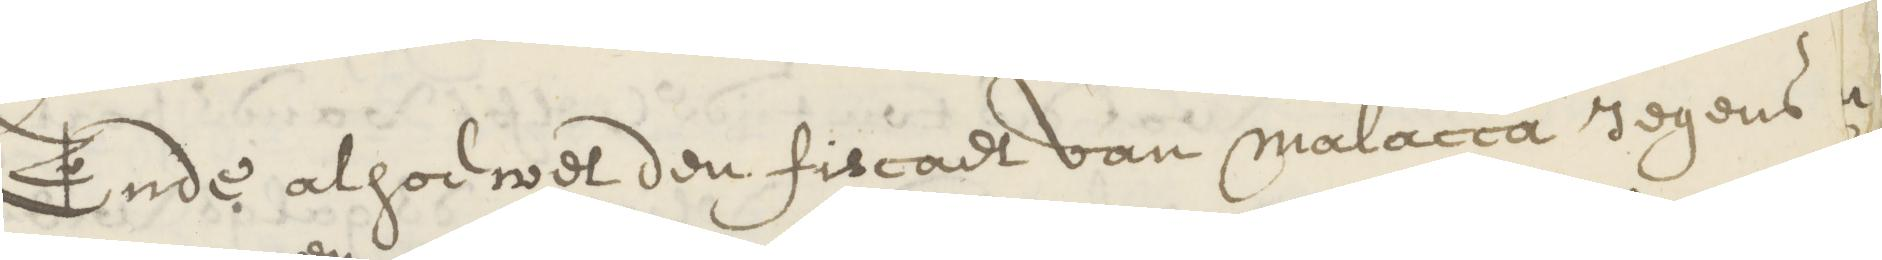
Ende alhoewel den fiscael van malacca Iegens
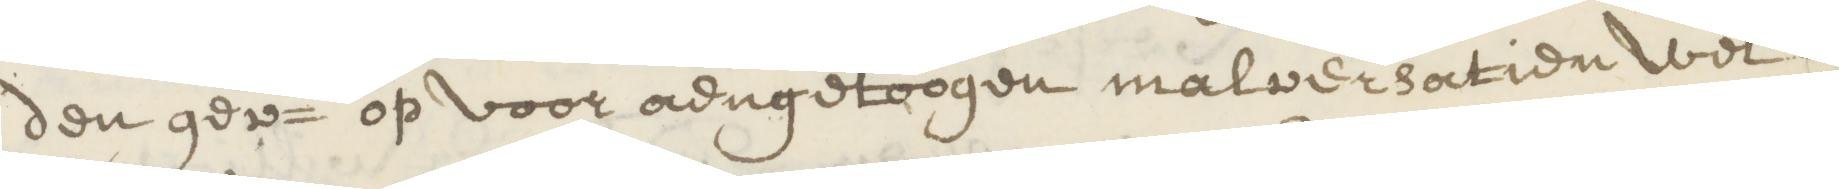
den gev=en op voor aengetoogen malversatien wel
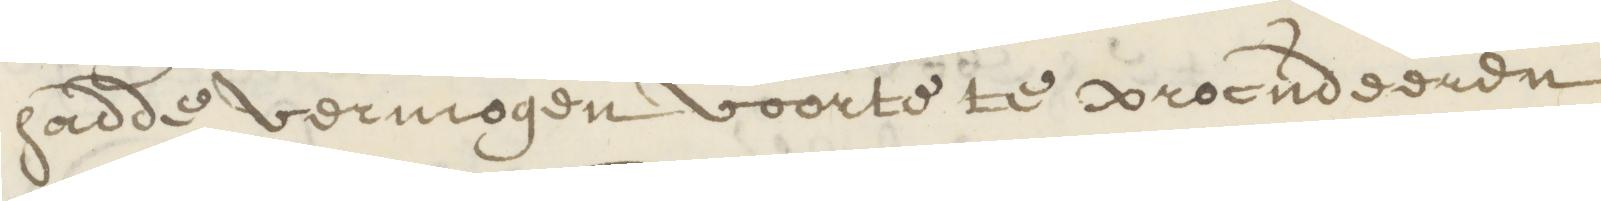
hadde vermogen voorte te procudeeren
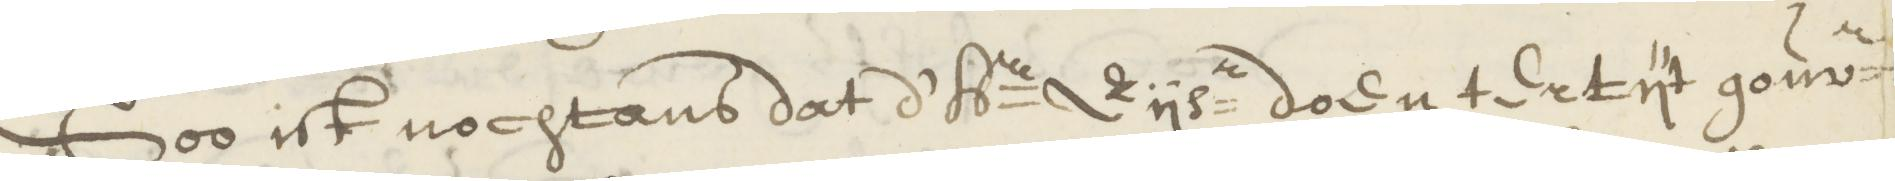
Soo ist nochtans dat d’h=r Eijs=r doen tertijt gouv=r
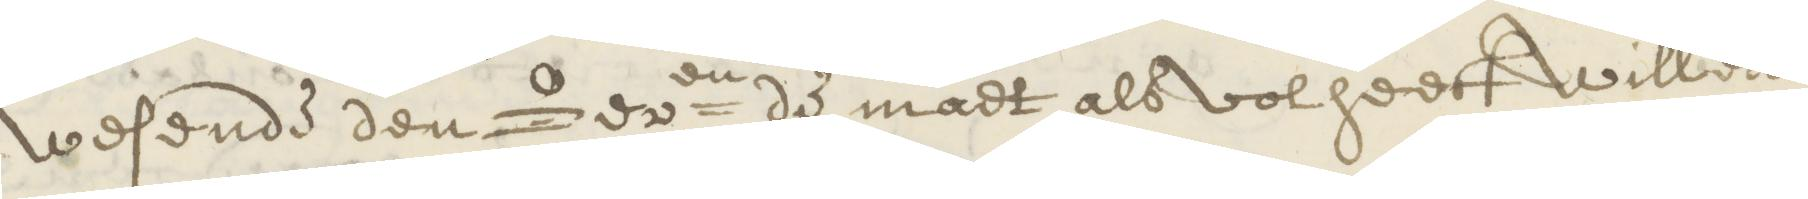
wesende den Gev=en de maet als vol heeft willen
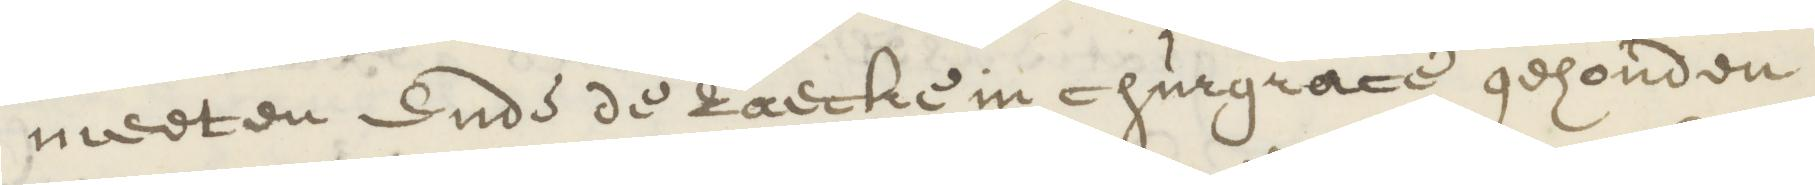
meeten Ende de zaecke in churgrace gehouden
